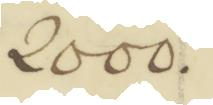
2000.
